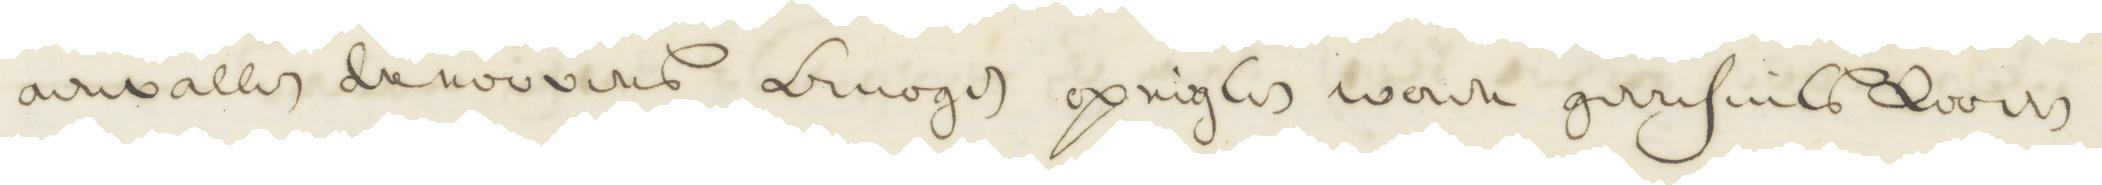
aenvallen der roovers te mogen oprigten waer geensints Zoo een
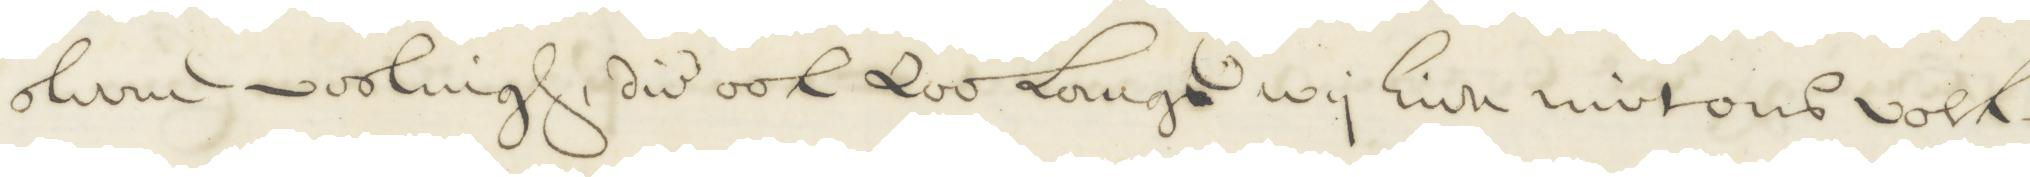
steene vestingh, die ook Zoo lange wij hier met ons volk
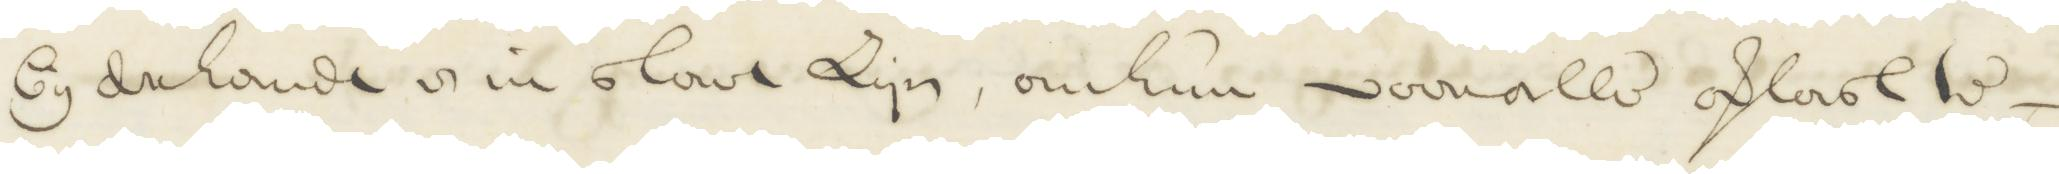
bij derhandt en in staet Zijn, om hun voor alle overlast te
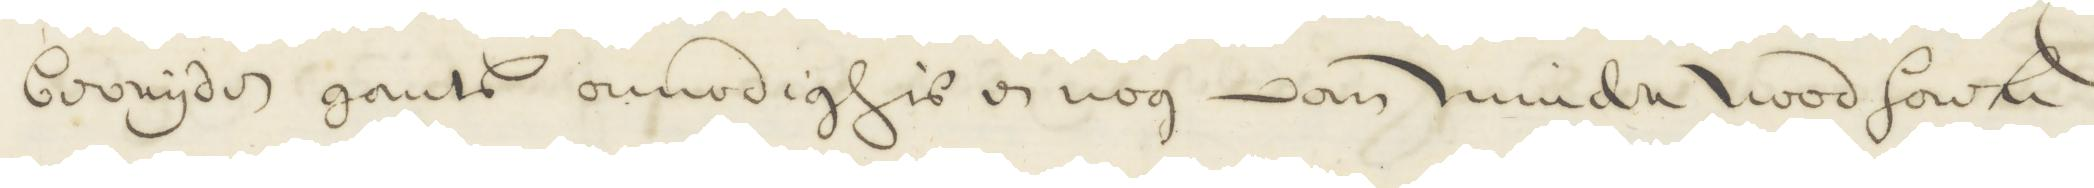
bevrijden gants onnodigh is en nog van minder noodsaeke
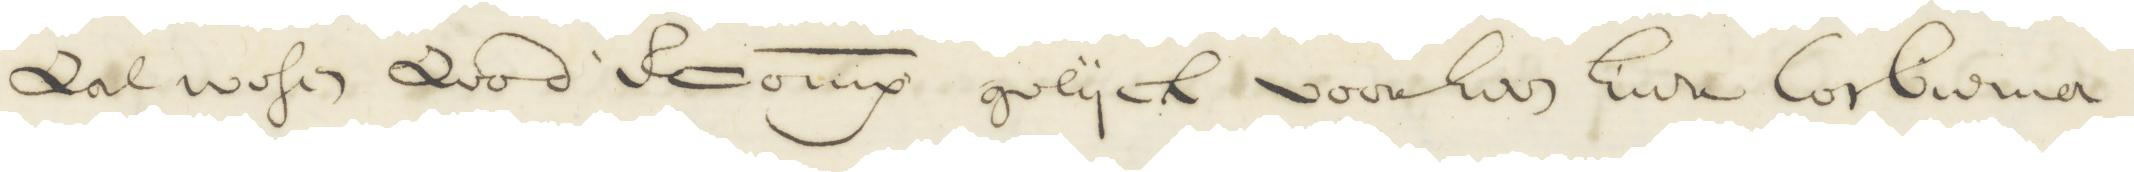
Zal wesen Zoo d' EComp: gelijck voor heen hier tot biema
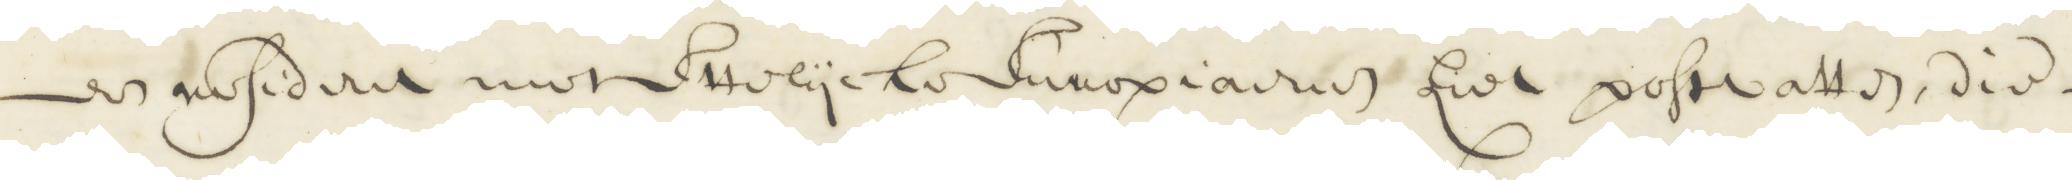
een resident met Ettelijcke Europiaenen Liet postvatten, die
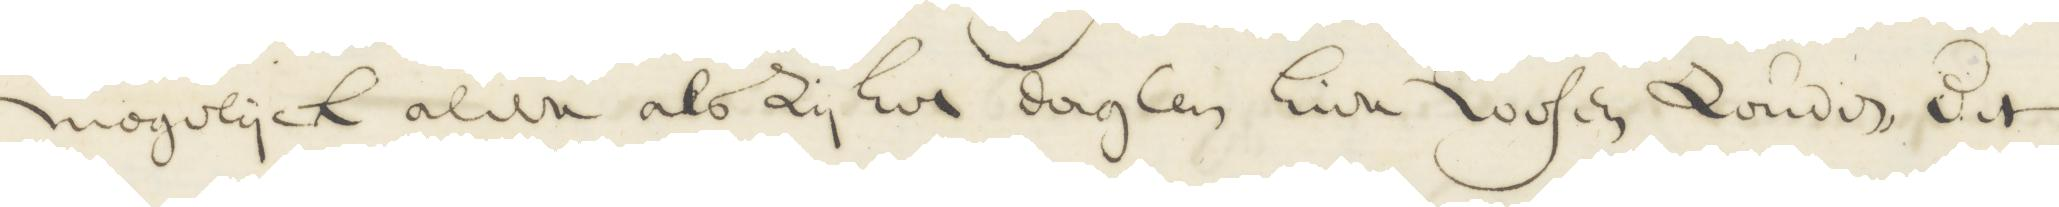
mogelijck aleer als Zij het dagten hier wesen Zouden, dit
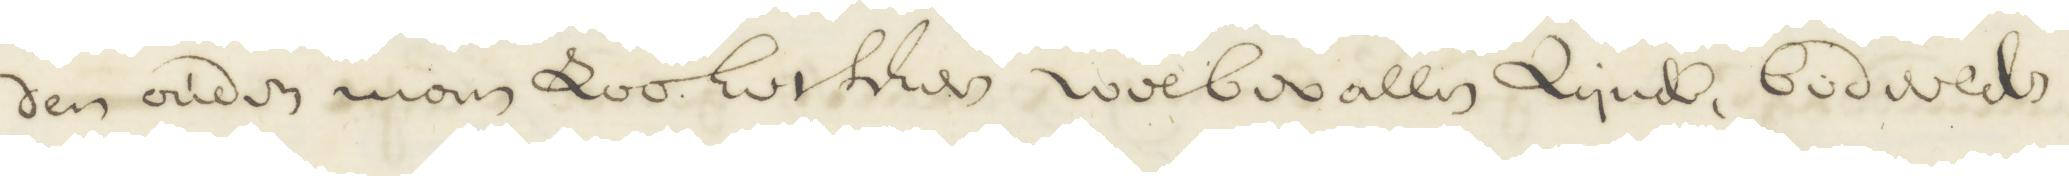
den ouden man Zoo het scheen welbevallen Zijnde, bedeelden
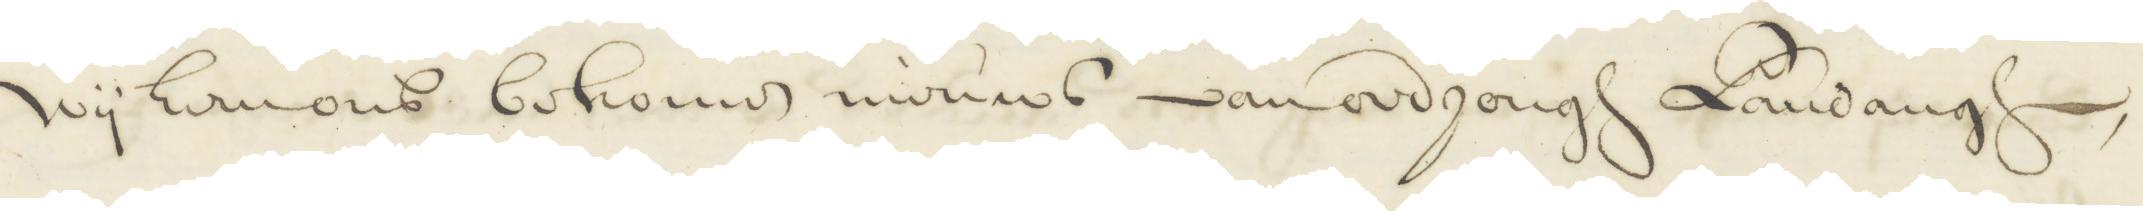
wij hem ons bekomen nieuws van oedjongh Pandangh,
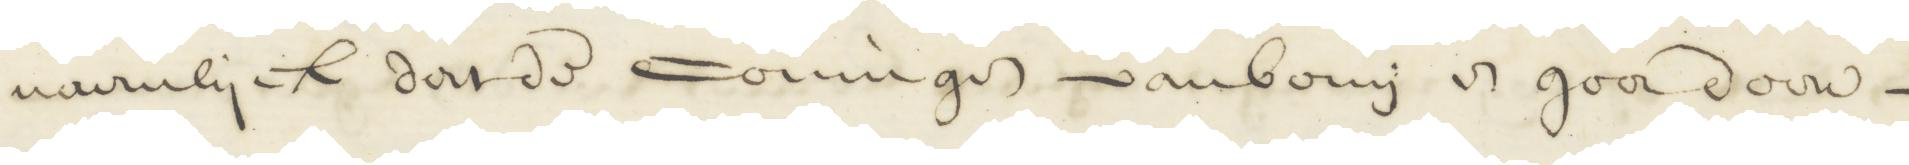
naemlijck dat de Coningen van bonij en goa door
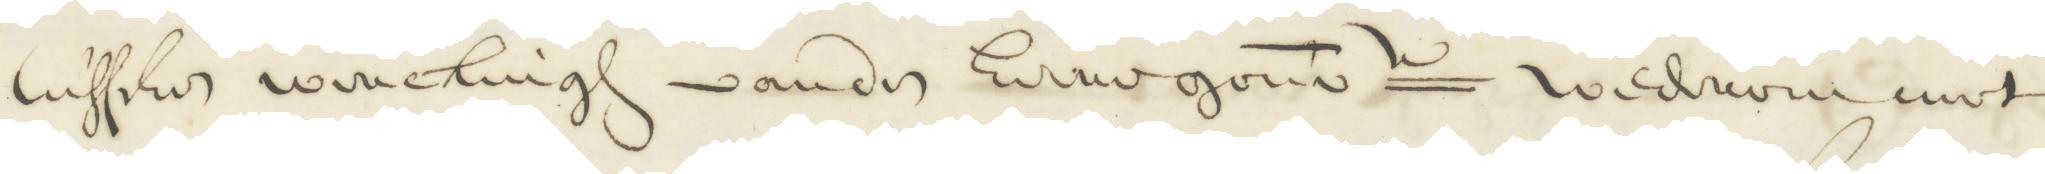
tusschen werckingh van den heere gouv=r wederom met
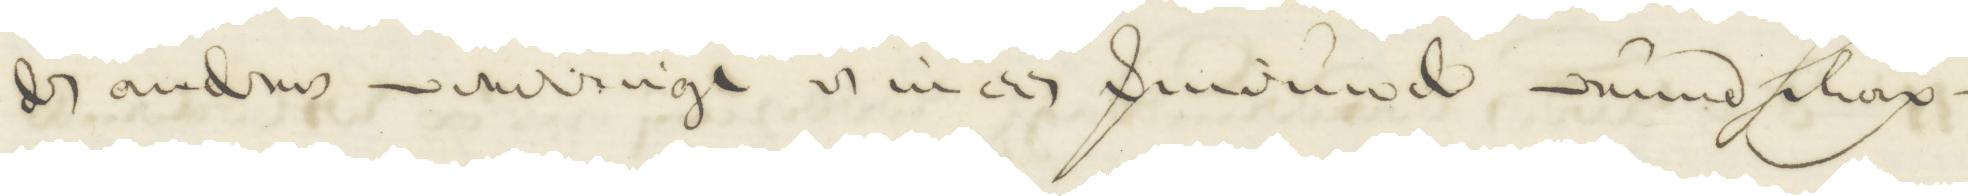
den anderen vereenigt en in een vernieuwde vrundschap
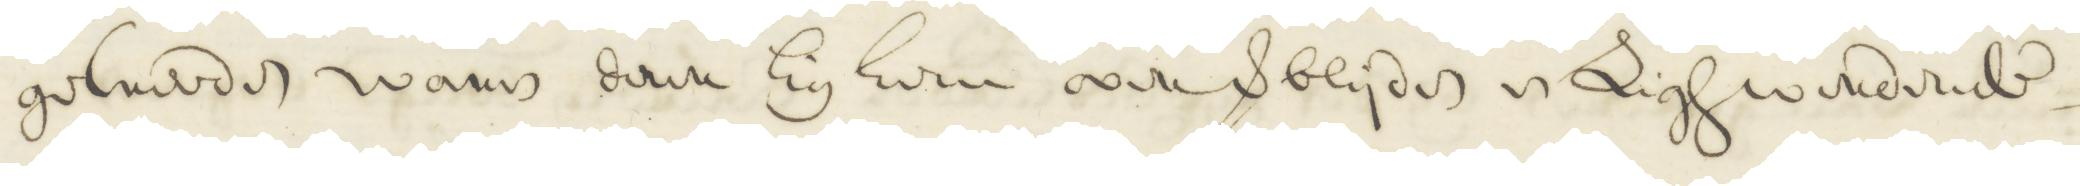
getreeden waren daer hij hem over verblijden en Zigh wendende
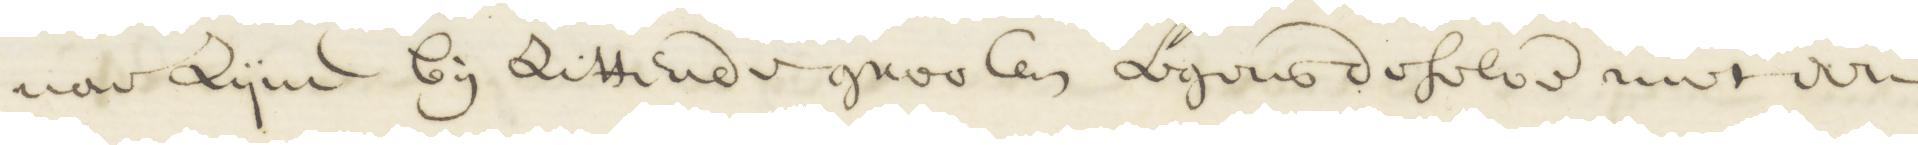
nae Zijne bij Zittende grooten tegens deselve met een
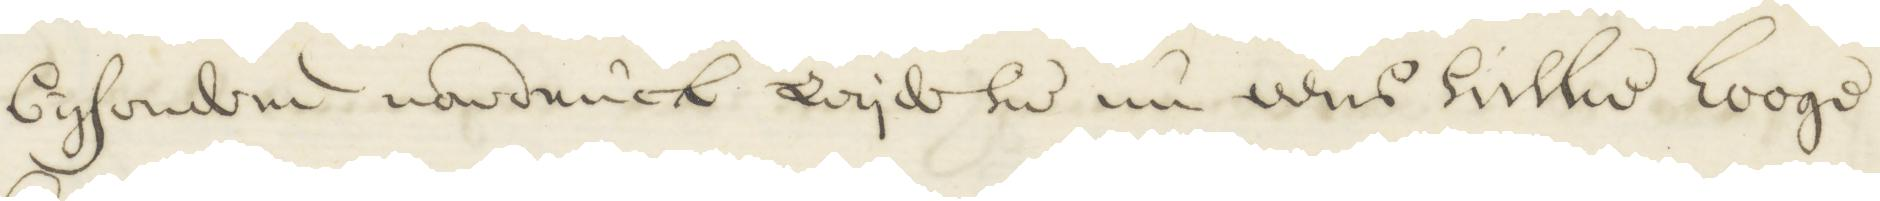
bijsondere naedruck zeijde sie nu eens Sulke hooge
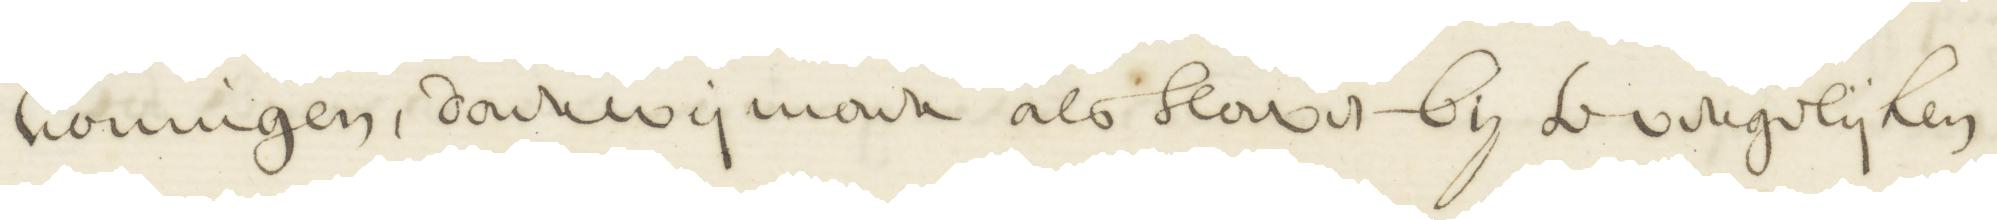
koningen, daer wij maer als Slaven bij te vergelijken
